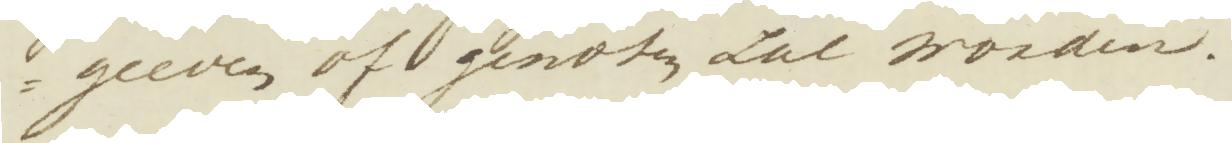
=geeven of genoten zal worden.
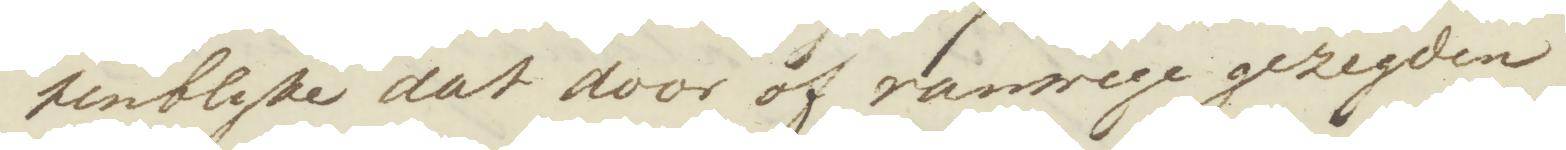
ten blyke dat door of vanwege gezegden
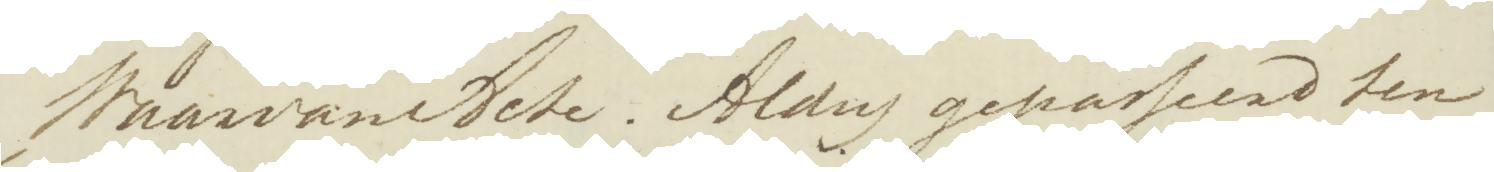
Waarvan Acte. Aldus gepasseerd ten
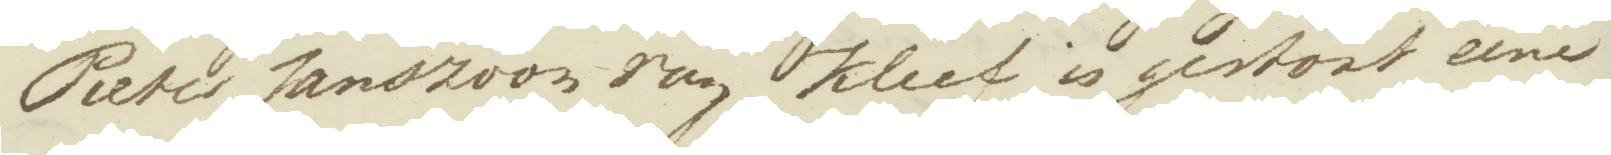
Pieter Janszoon van Kleef is gestort eene
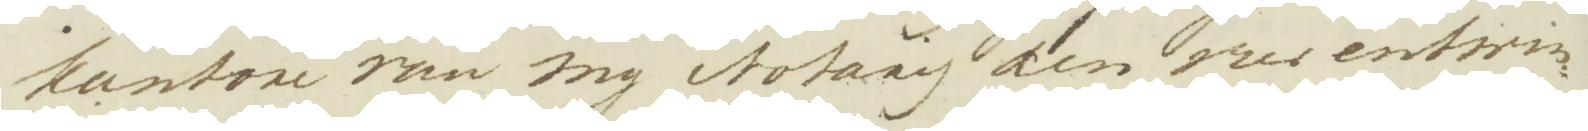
kantore van my Notaris den vier en twin:
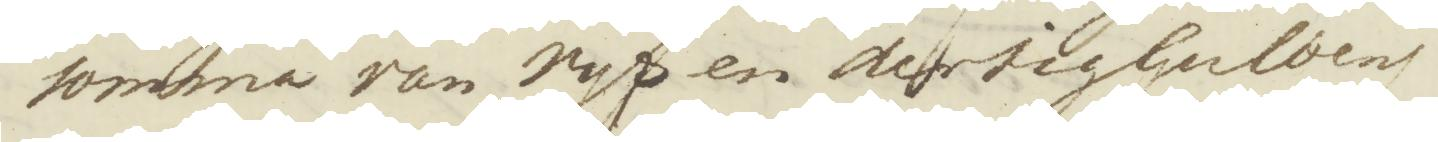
somma van vyf en dertig Guldens
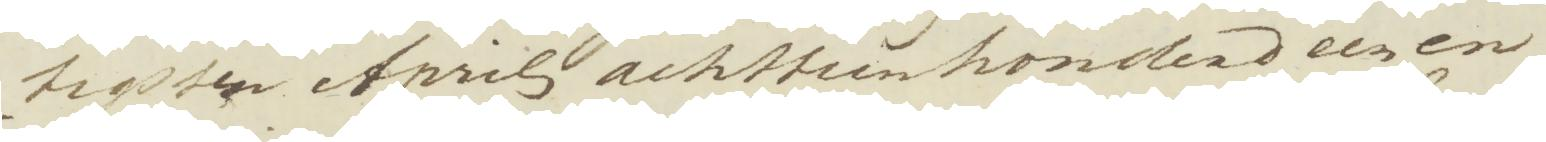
=tigsten April achttienhonderd een en
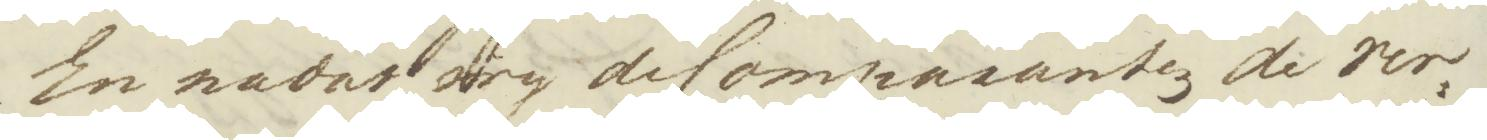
En nadat wy de Comparanten de ver:
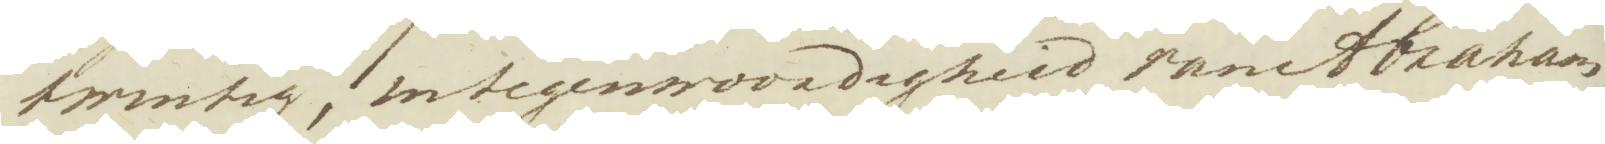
twintig, integenwoordigheid van Abraham
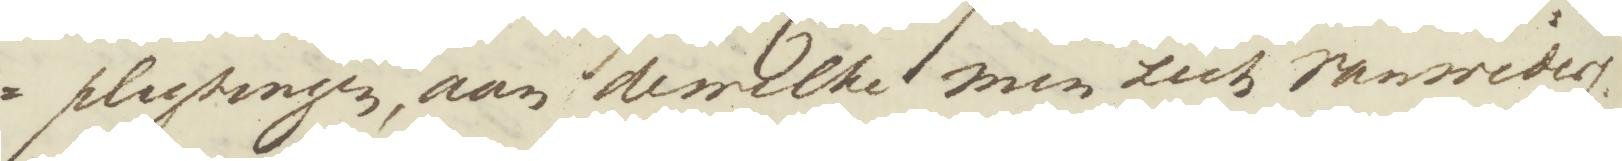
=pligtingen, aan dewelke min zich van weders:
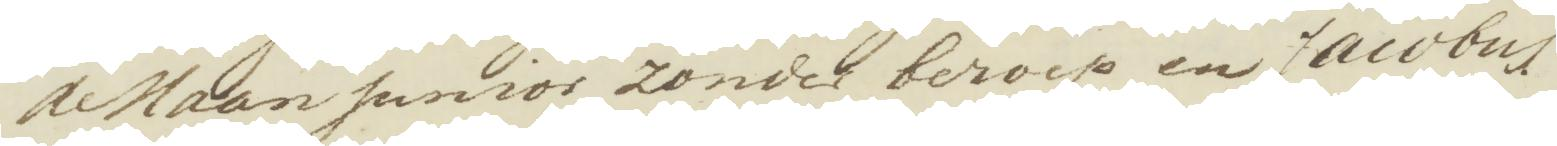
de Haan junior, zonder beroep en Jacobus
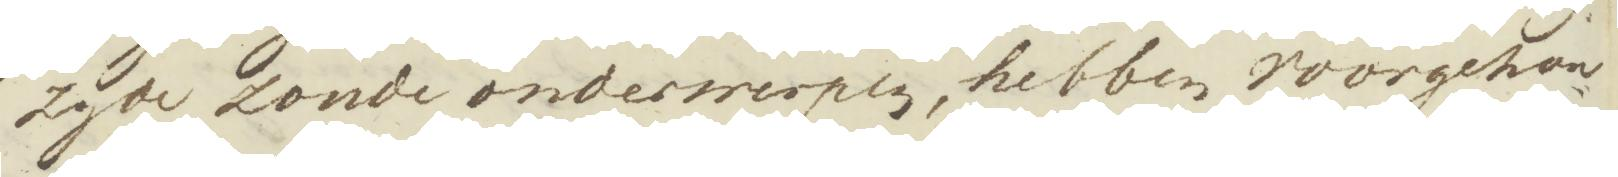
zyde zoude onderwerpen, hebben voorgehou=
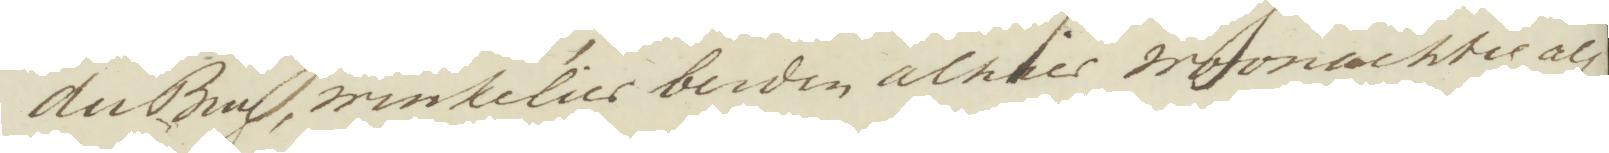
du Buy, winkelier beiden alhier woonachtig als
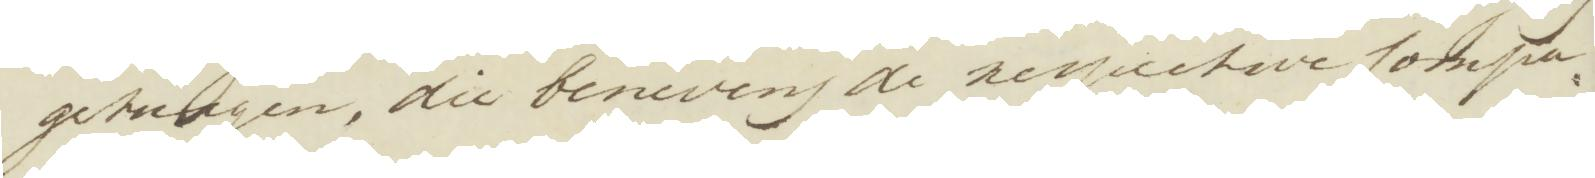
getuigen, die benevens de respective Compa=
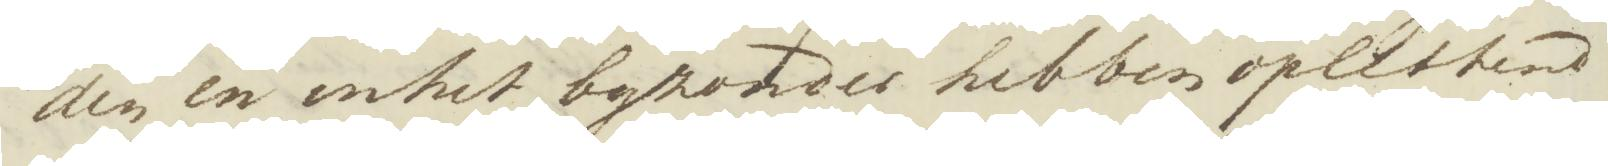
=den en in het byzonder hebben oplettend
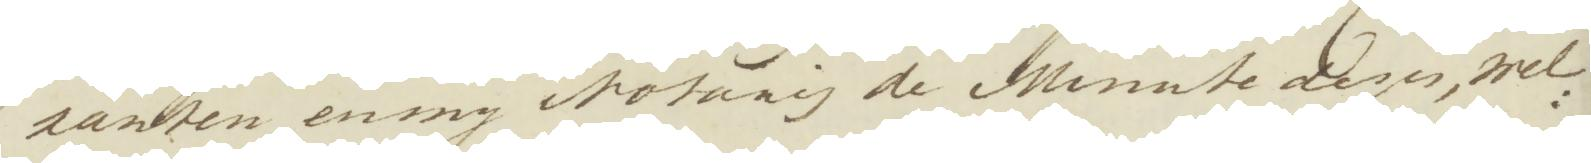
ranten en my Notaris de Minute deses, wel:
